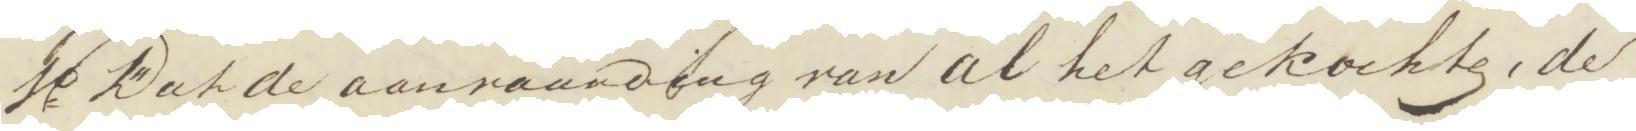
1=o Dat de aanvaarding van al het gekochte, de
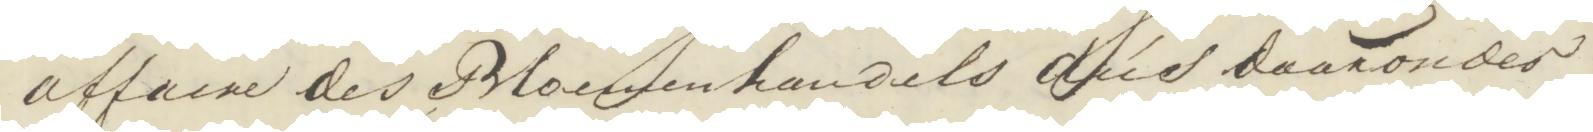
affaire des Bloemenhandels dus daaronder
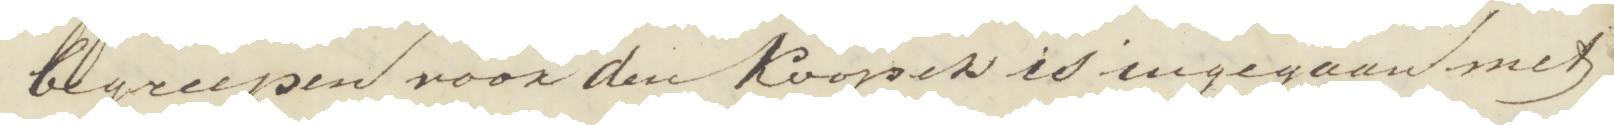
begreepen voor den kooper is ingegaan met
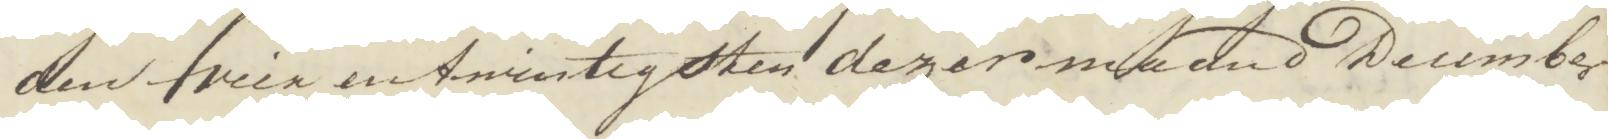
den vier en twintigsten dezer maand December
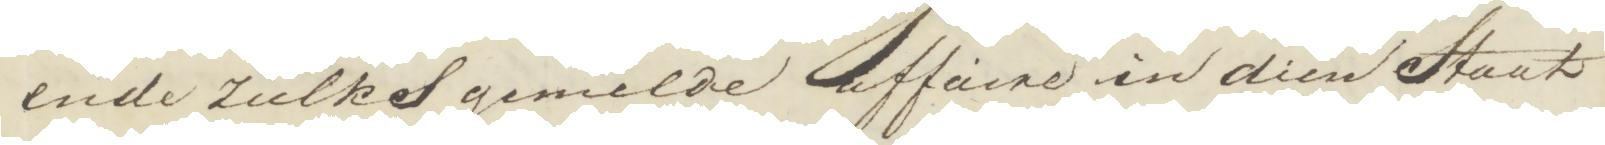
ende zulks gemelde affaire in dien staat
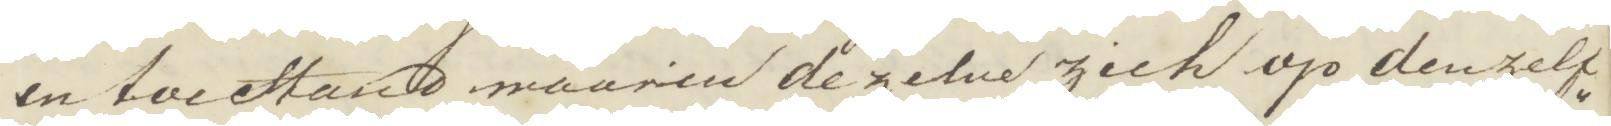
en toestand waarin dezelve zich op denzelf„
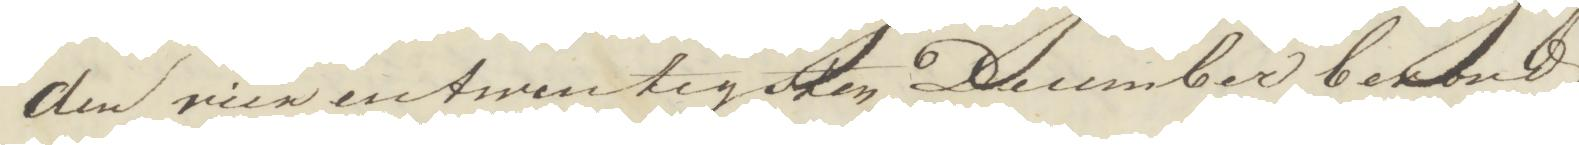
den vier en twintigsten December bevond,
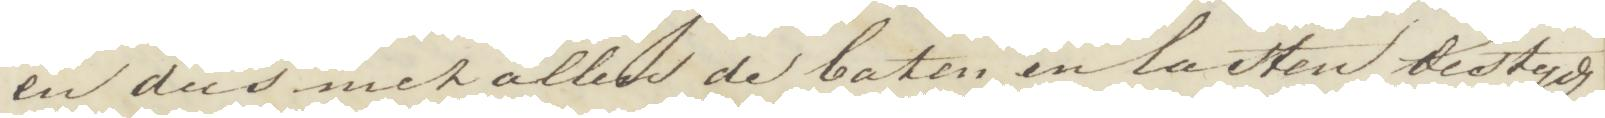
en dus met allen de baten en lasten destyds
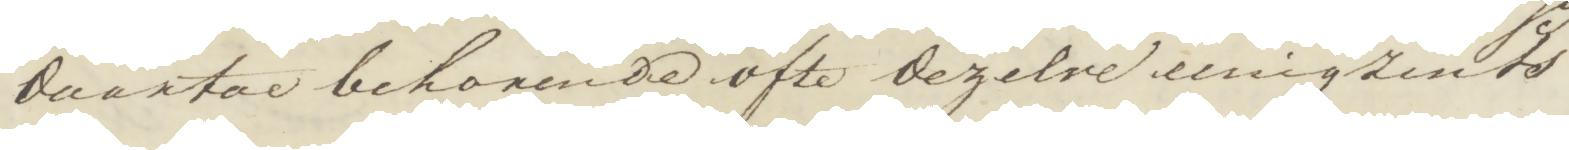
daartoe behorende ofte dezelve eenigzints
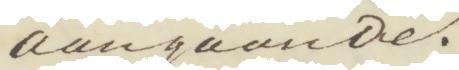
aangaande.
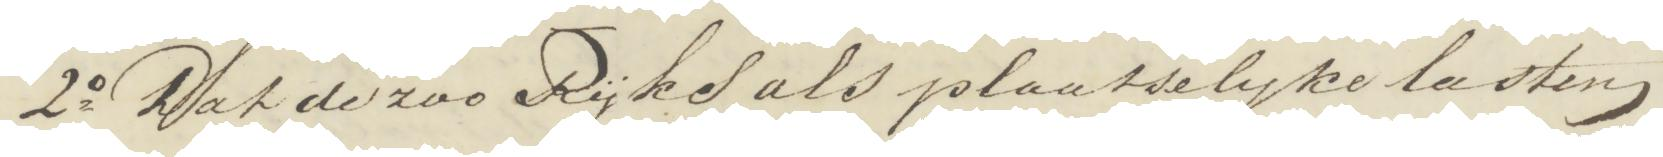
2=o Dat de zoo Rijks als plaatselyke lasten
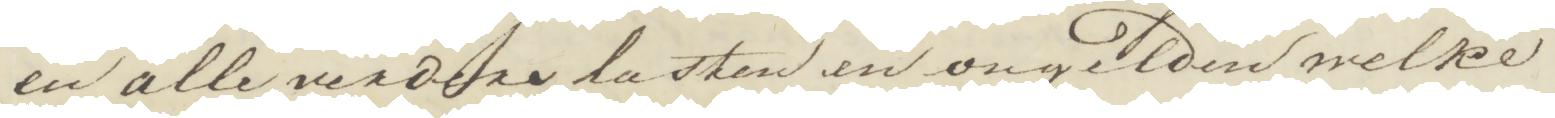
en alle verdere lasten en ongelden welke
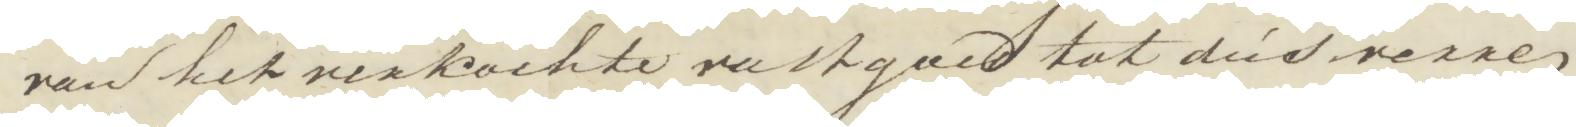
van het verkochte vastgoed tot dus verre
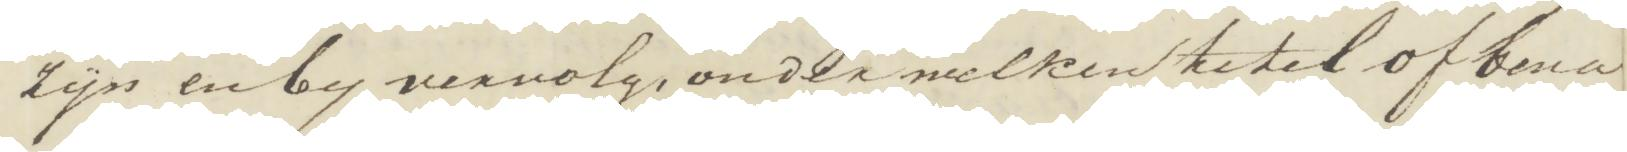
zijn en by vervolg, onder welken titel of bena
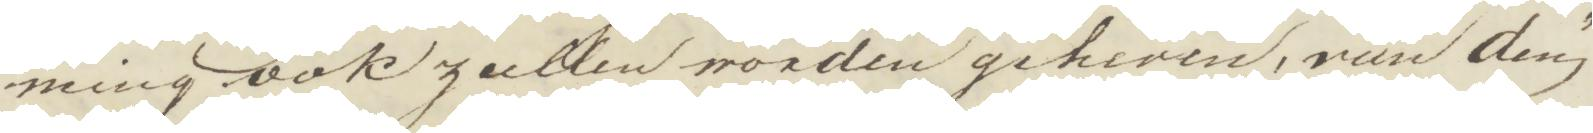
„ming ook zullen worden geheven, van den
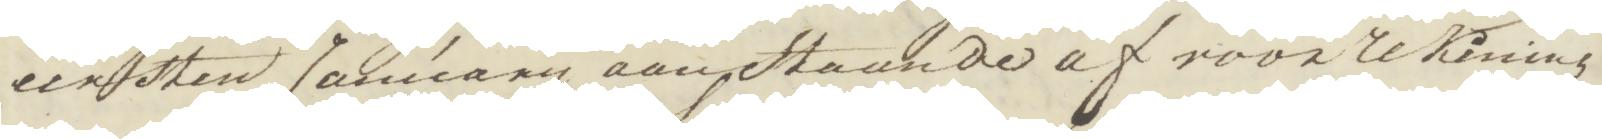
eersten Januarij aanstaande af voor rekening
